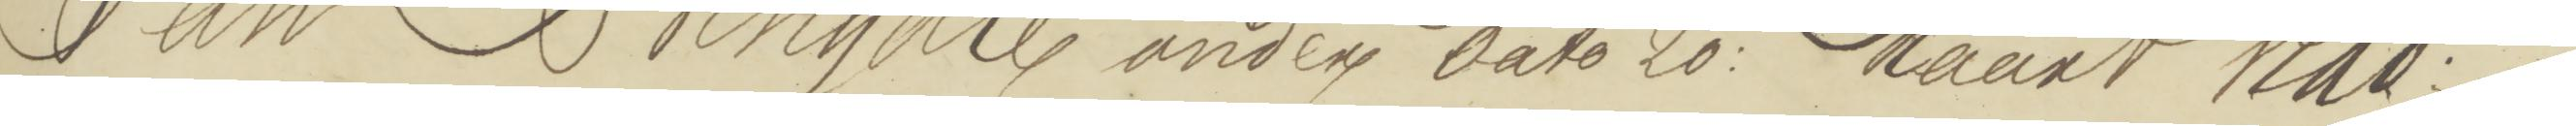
Van Bengale onder dato 20: Maart 1740:
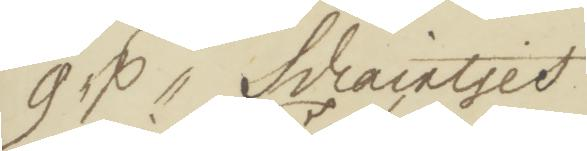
9:p„s Schairtjes
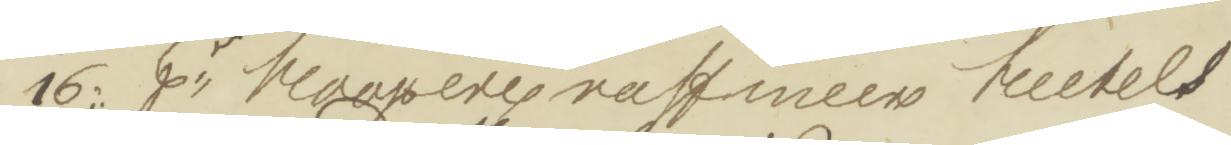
16: p„s koopere raffineer keetels
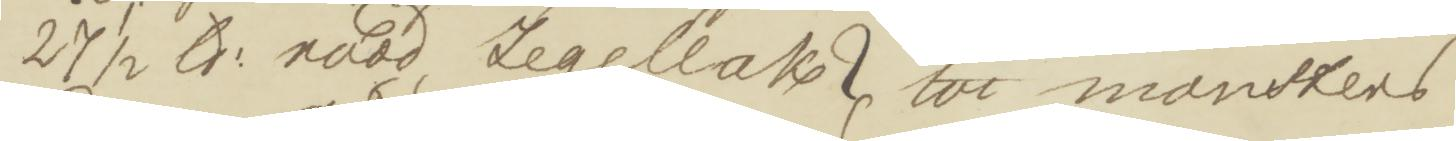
27½ lb: rood zegellak tot monsters
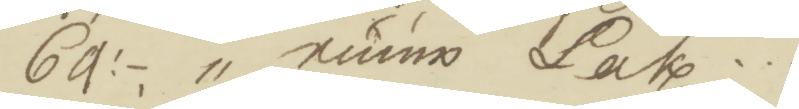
64:– „ ruw lak . .
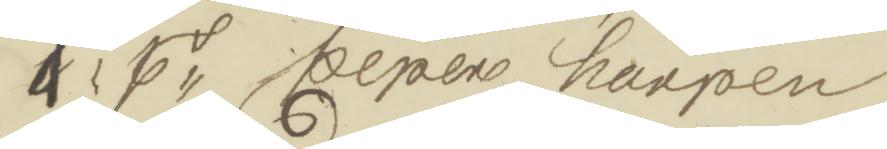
4: p„s peper harpen
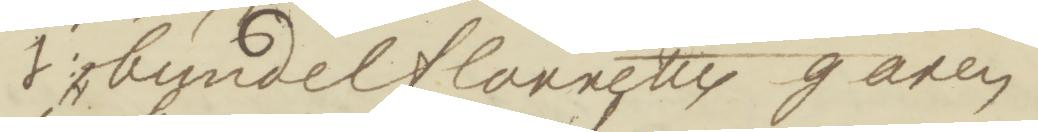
1:„ bundel florette garen
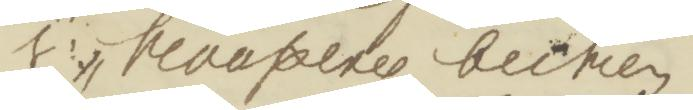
1:.„ koopere becken
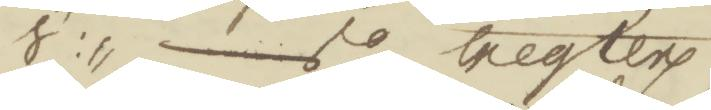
1: „ _o tregter
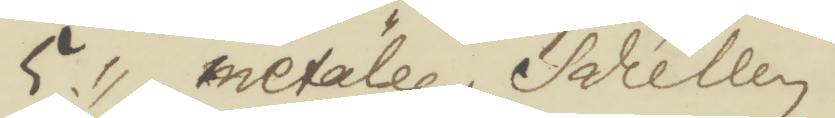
5. „ metale schellen
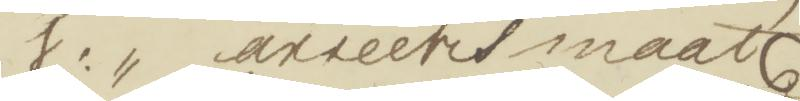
1: „ arreeks maat
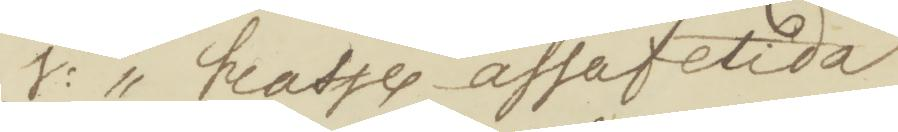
1: „ kasje assafetida
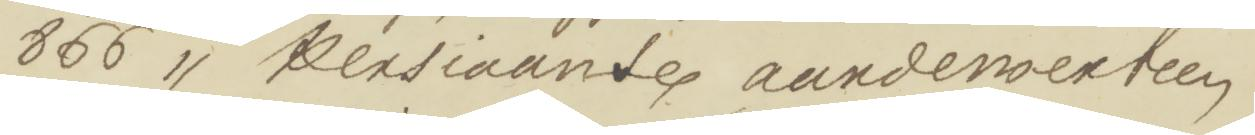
866 „ persiaanse aardewerken
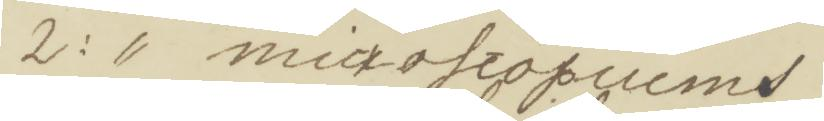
2: „ microscopiums
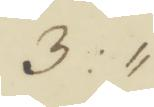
3: „
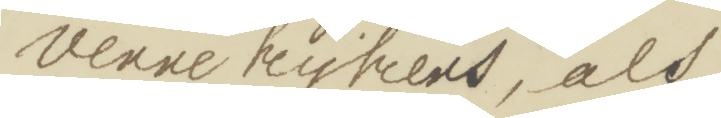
verre kijkers, als
